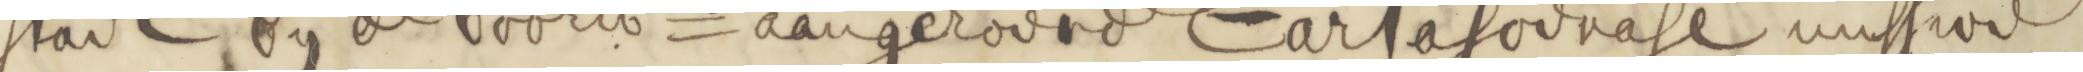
staet bij de voorw=ts aangeroerde Cartasoerase missive
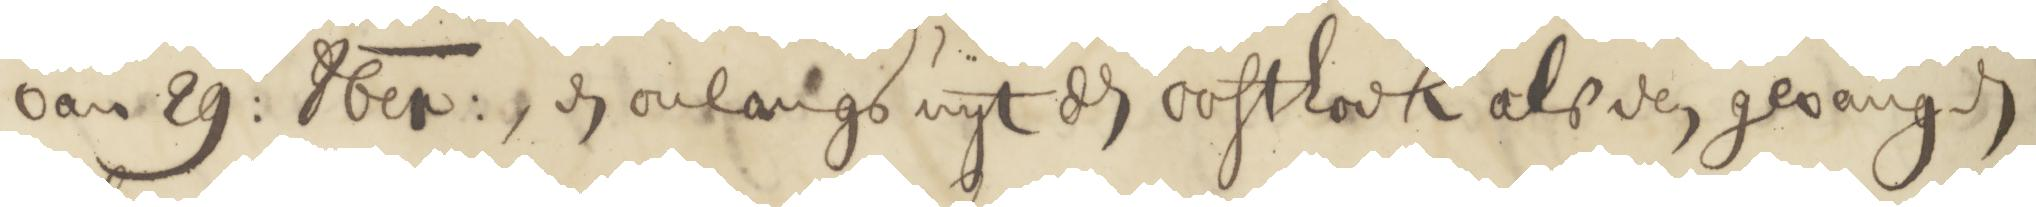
van 29:' 8ber:, en onlangs uijt den oosthoek als een gevangen
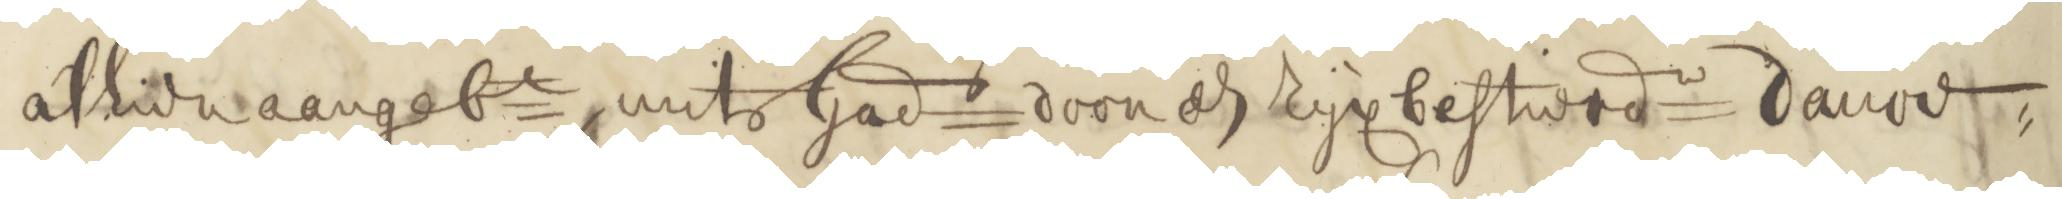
alhier aangeb=t, mitsgad=s door den rijx bestierd=r danoe„
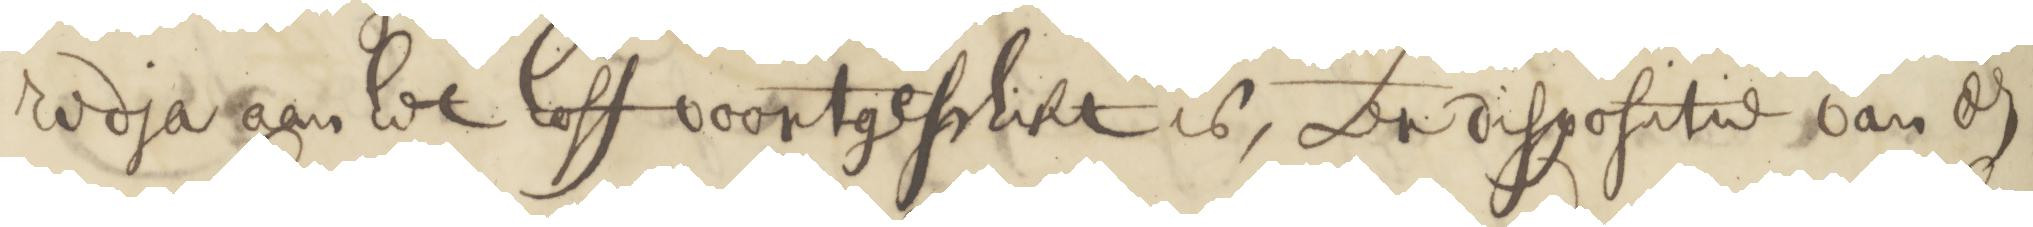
redja aan het hoff voortgeschikt is, ter dispositie van den
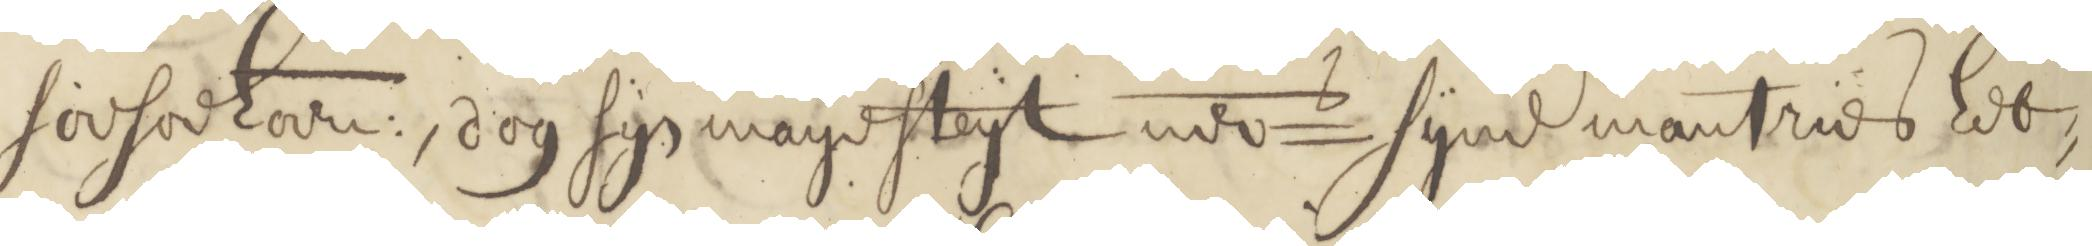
soesoehoen:, dog sijn maijesteijt nev=s sijne mantries heb„
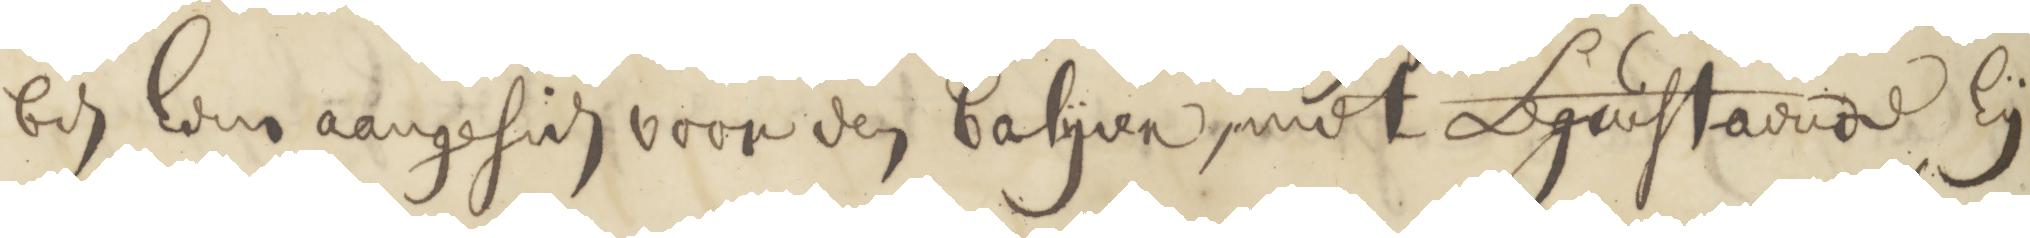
ben hem aangesien voor een balijer, niet tegenstaende hij
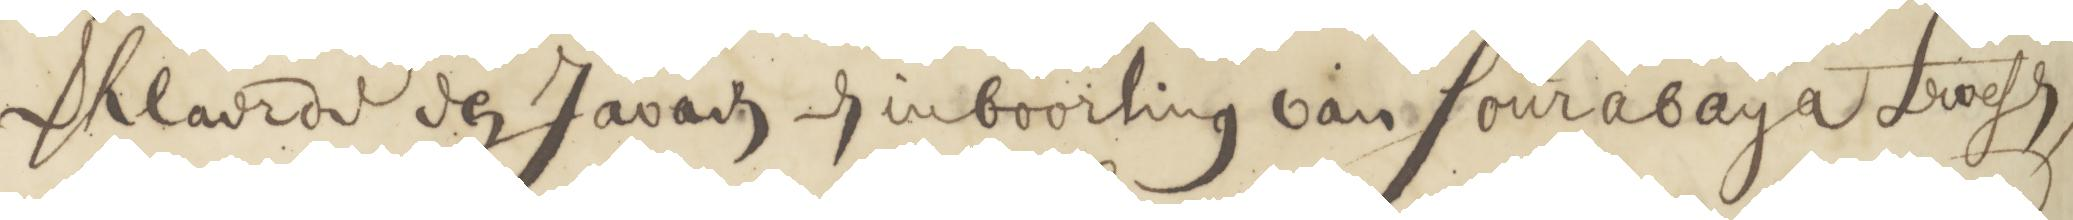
verklaerde een Javaen en in boorling van Sourabaija tewesen,
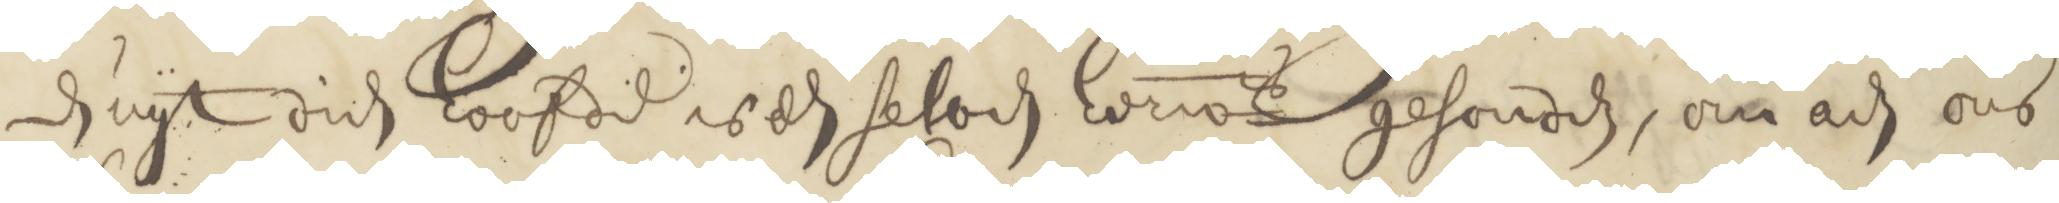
en uijt dien hoofde is den selven herw=ts gesonden, om aen ons
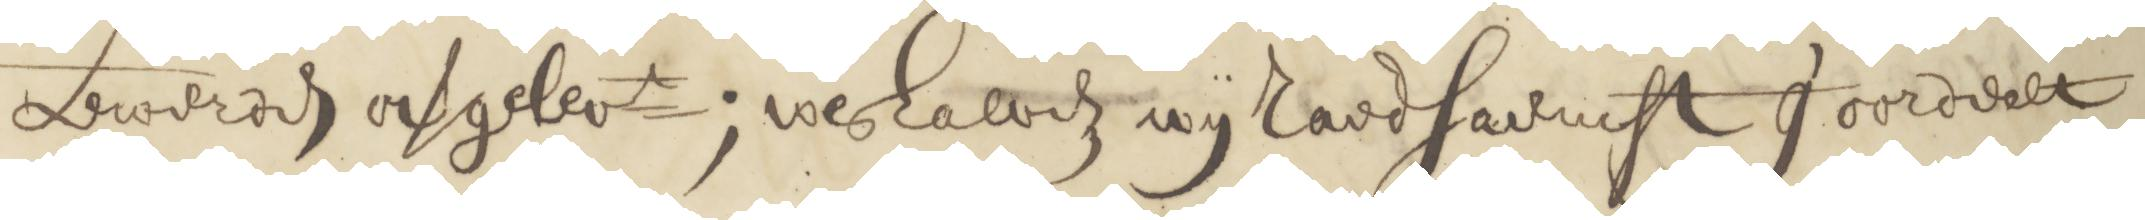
te werden overgelev=t; weshalven wij raedsaemst g'oordeelt
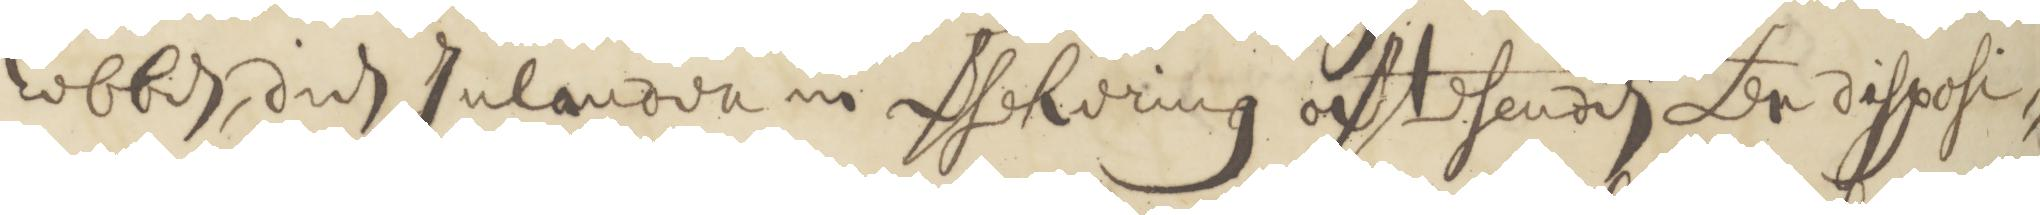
hebben, dien Jnlander in versekering over te senden ter disposi„
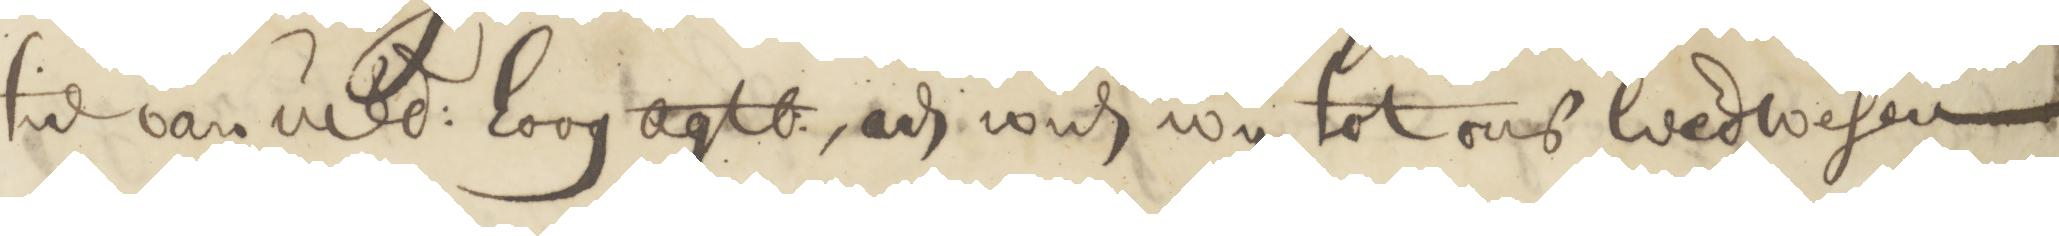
tie van uEd: hoog agtb:, aen wien wij tot ons leedwesen
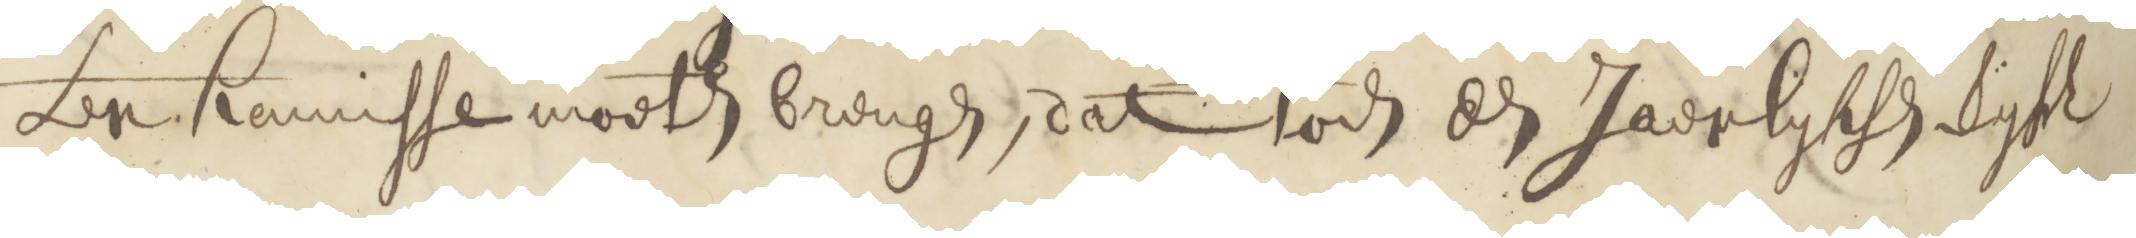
ten kennisse moeten brengen, dat toen den Jaerlijksen Eijsch
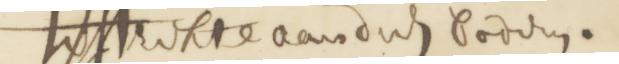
'tverstrekte aan dien bodem
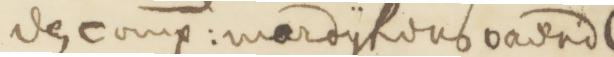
den comp: mardijkers vaerd
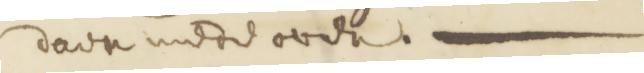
daer mede over. —
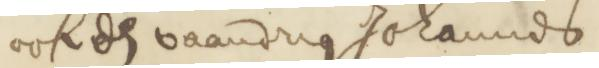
ook den vaandrig Johannes
